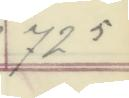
725
